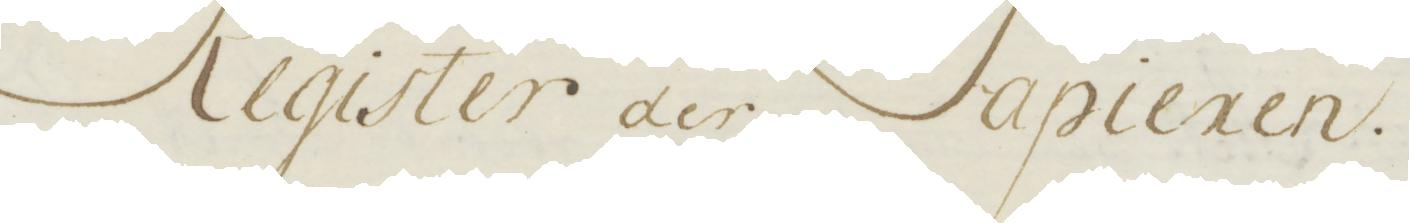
Register der Papieren.
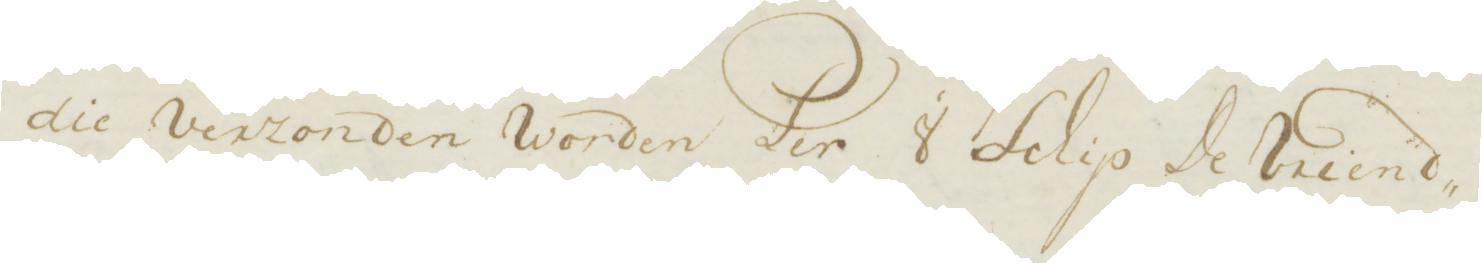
die verzonden worden Per ’t schip De Vriend„
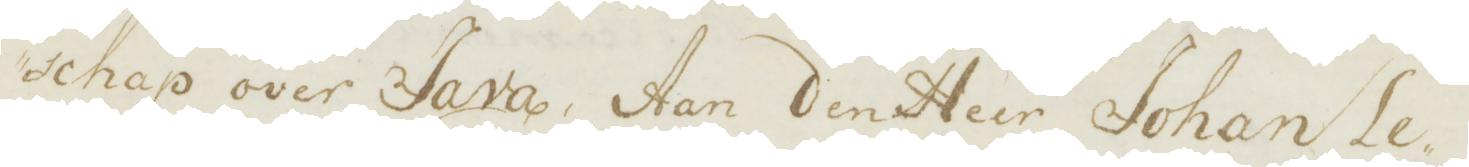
„schap over Java, Aan den Heer Johan Le„
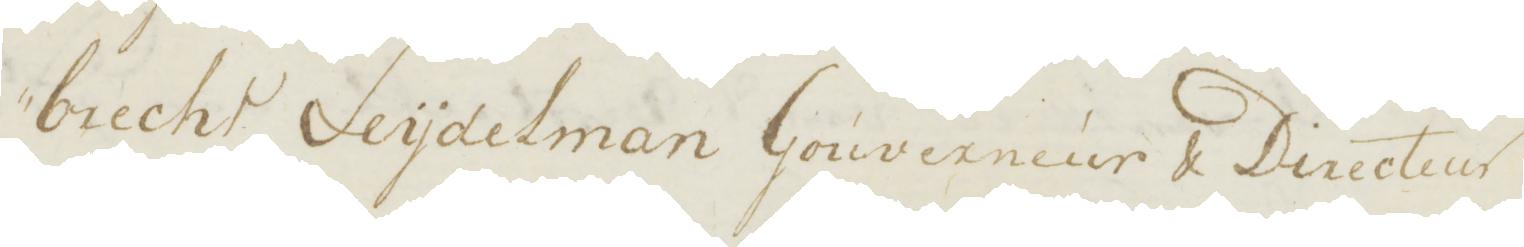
„brecht Seijdelman Gouverneur & Directeur
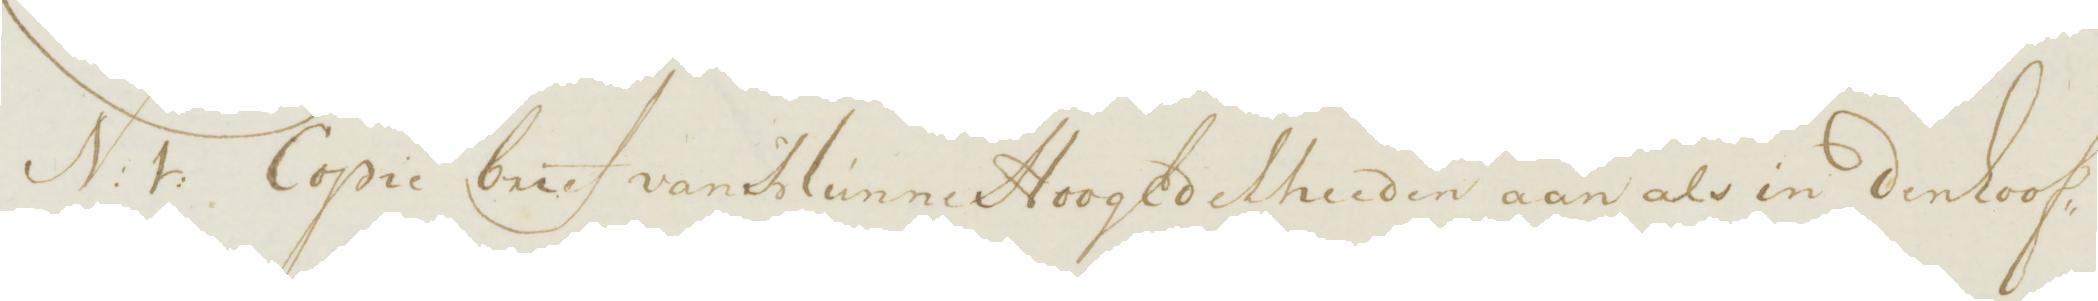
N: 1o: Copie brief van Hunne HoogEdelheeden aan als in den hoof„
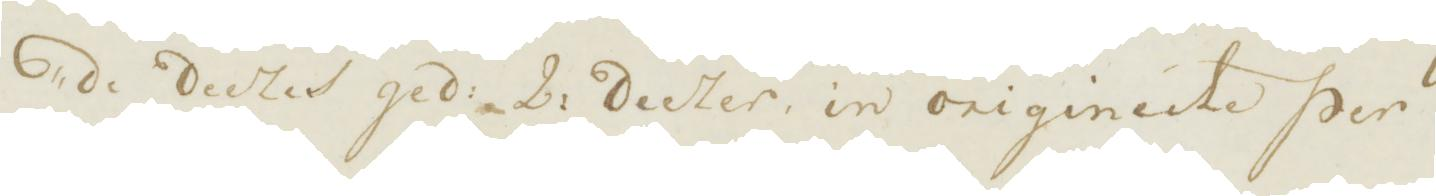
de deezes ged: 2: deezer, in origineele per
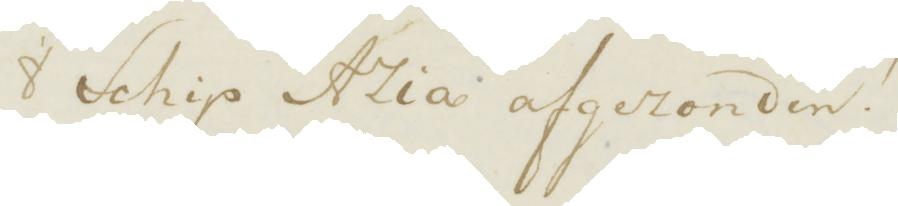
't schip Azia afgezonden.
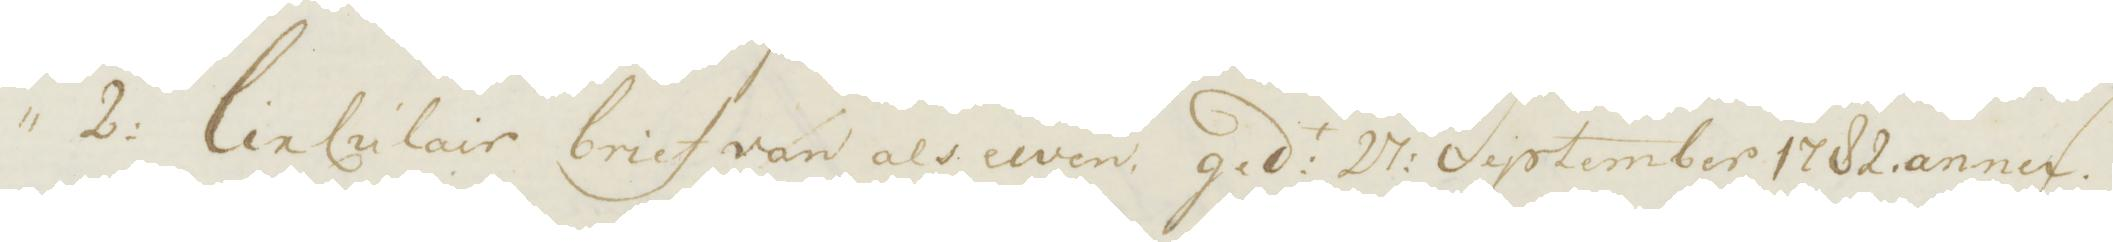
„ 2: Circulair brief van als eeven ged:t 27: September 1782 annex.
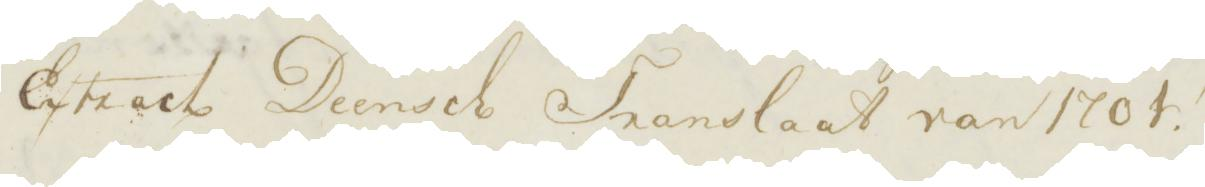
Extract Deensch Translaat van 1701.
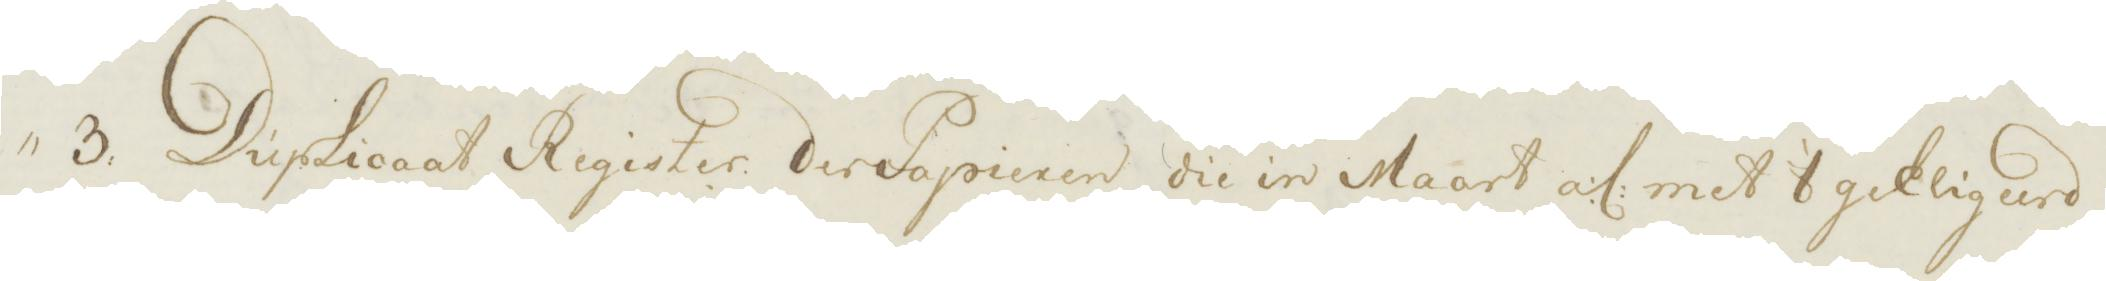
„ 3. Duplicaat Register der Papieren die in Maart al met 't geEligeerd
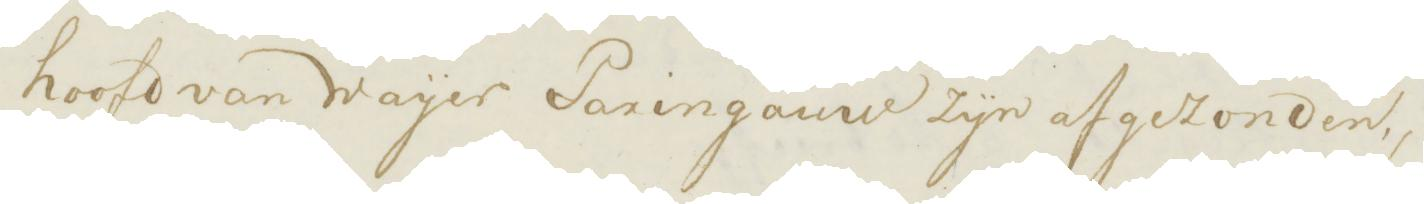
hoofd van Waijer Paringauw zijn afgezonden,
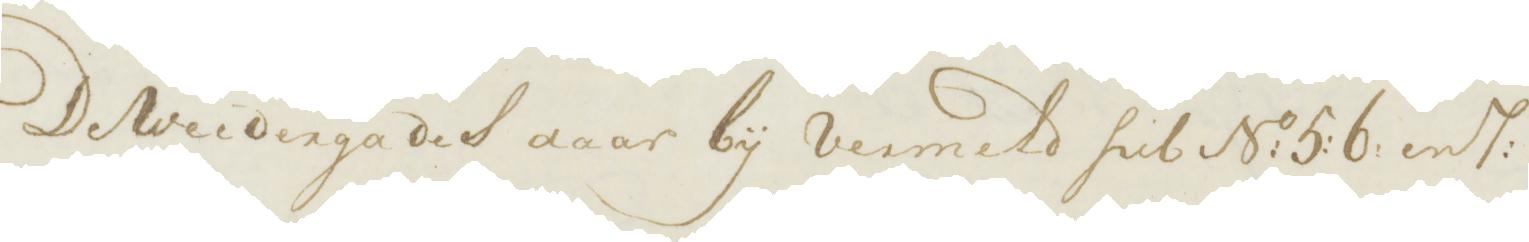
De weidergades daar bij vermeld sub N:o 5: 6: en 7:
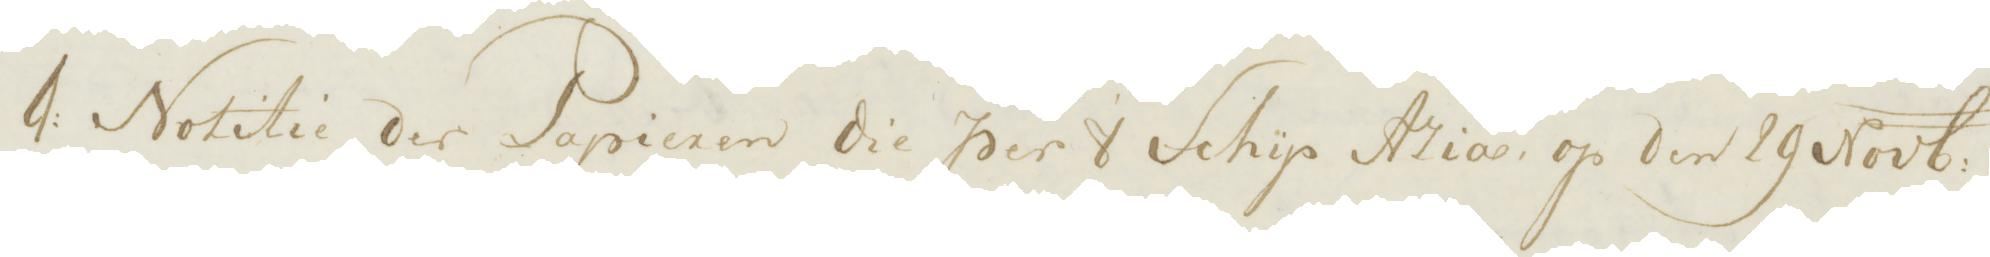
4: Notitie der Papieren die per ’t schip Azia op den 29 Novb:
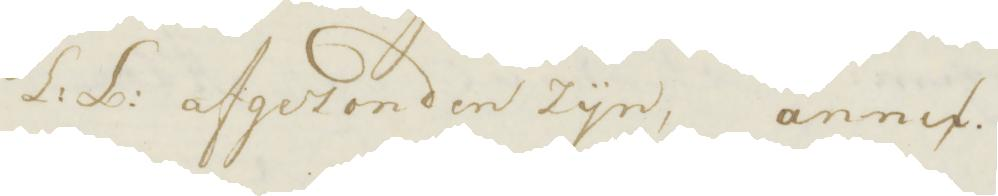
I:L: afgezonden zijn, annex
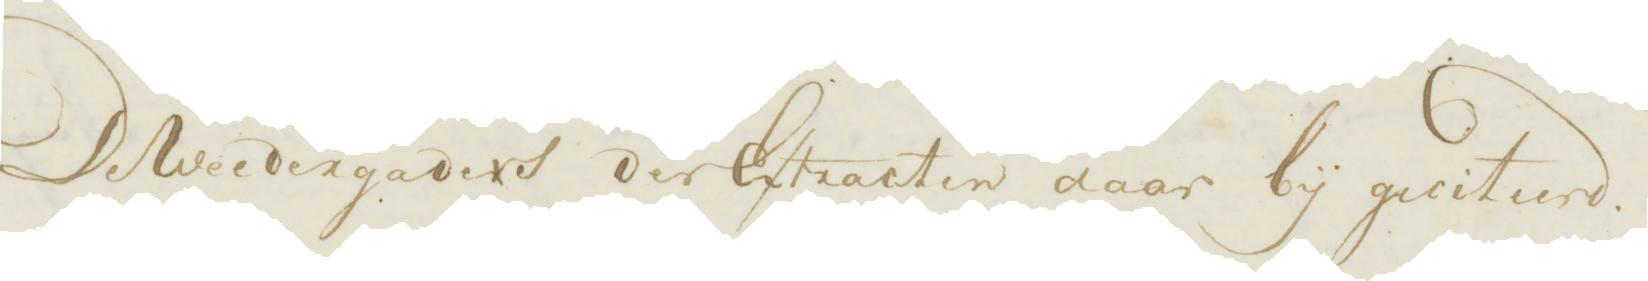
De Weedergaders der Extracten daar bij geciteerd.
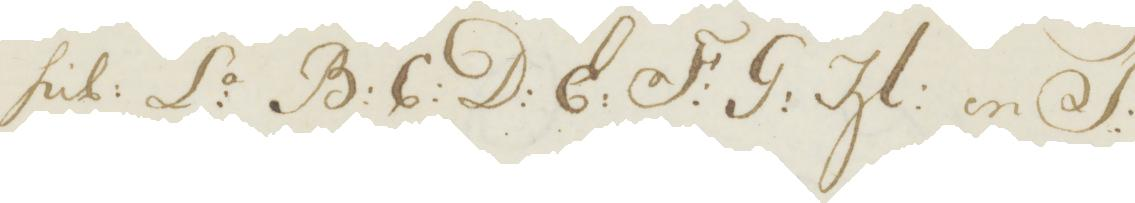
sub: L:a B: C: D: E: F: G: H: en I:
